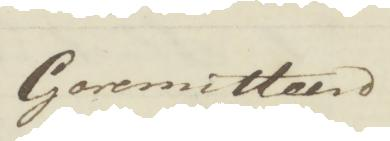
Geremitteerd
